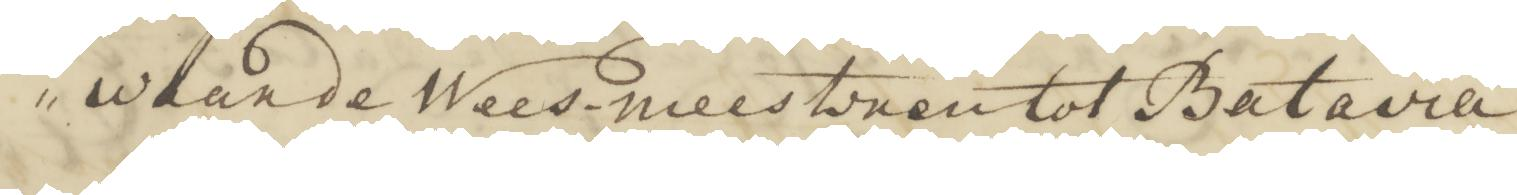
„waarde wees-meesteren tot Batavia
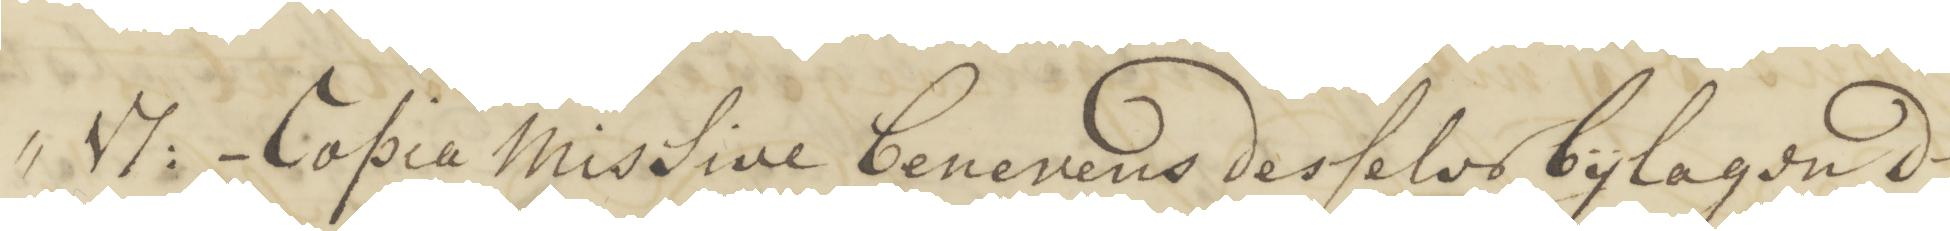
„ 17: – Copia missive benevens desselvs bijlagen d
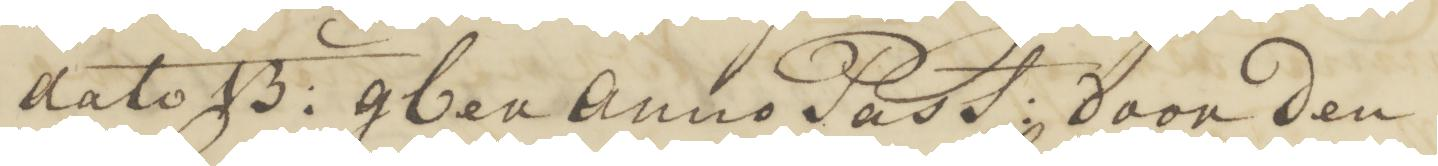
dato 13:e 9ber anno Pass: door den
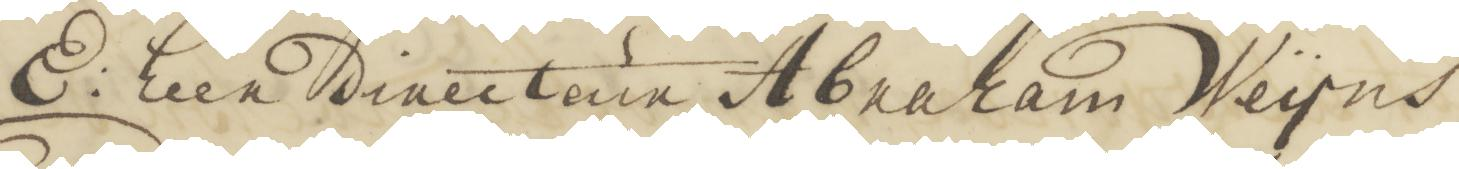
E: heer directeur Abraham Weijns
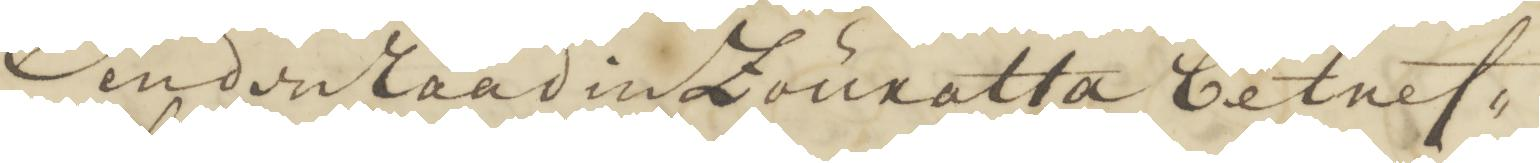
en den raad in Zouratta betref„
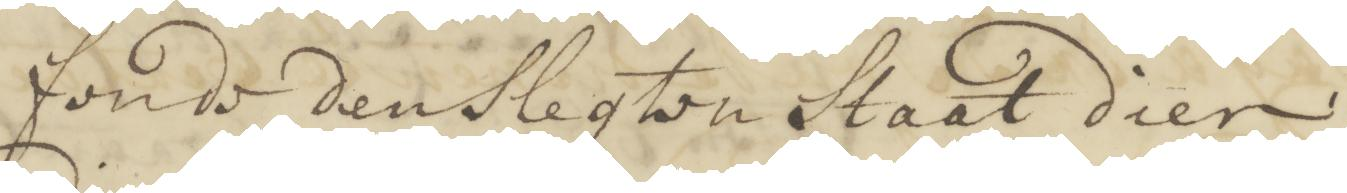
fende den slegten staat dier
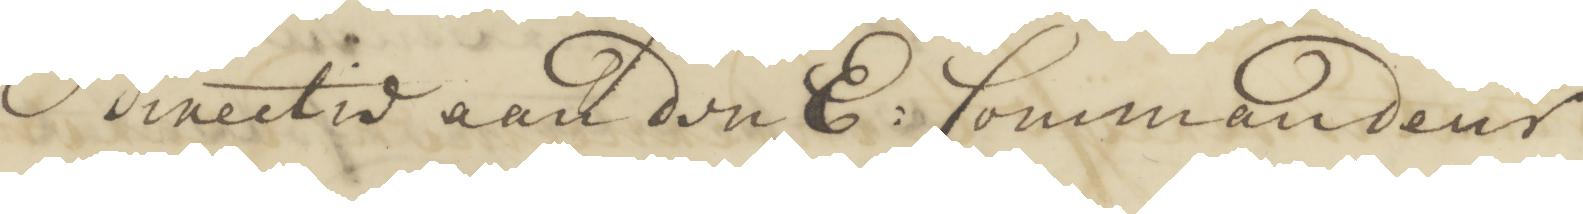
directie aan den E: Commandeur
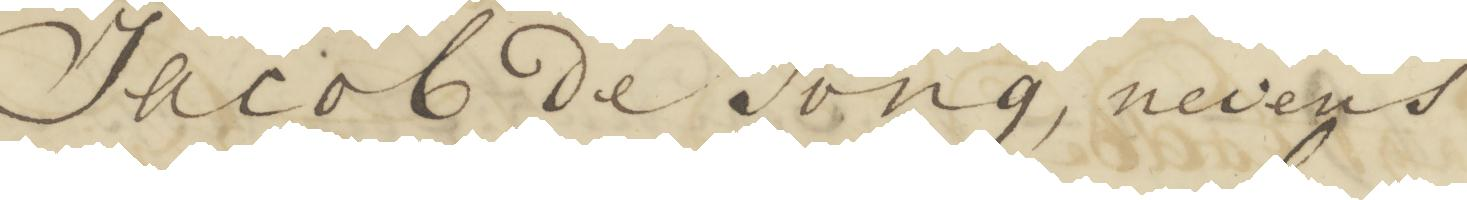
Iacob de Iong, nevens
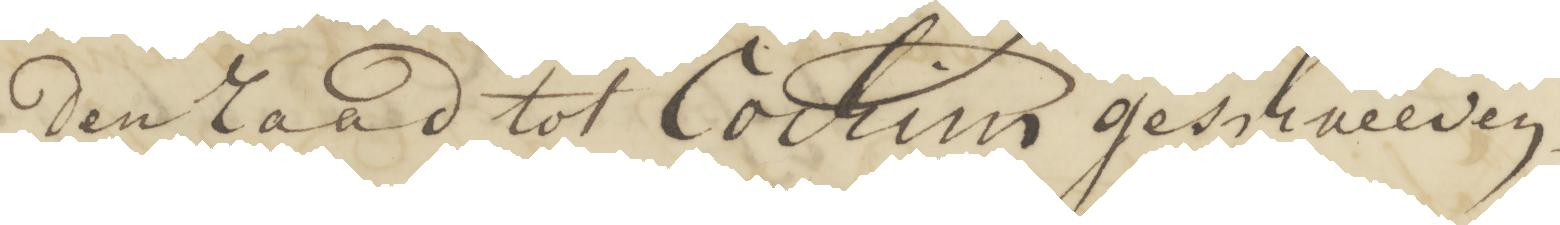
den raad tot Cochim geschreeven
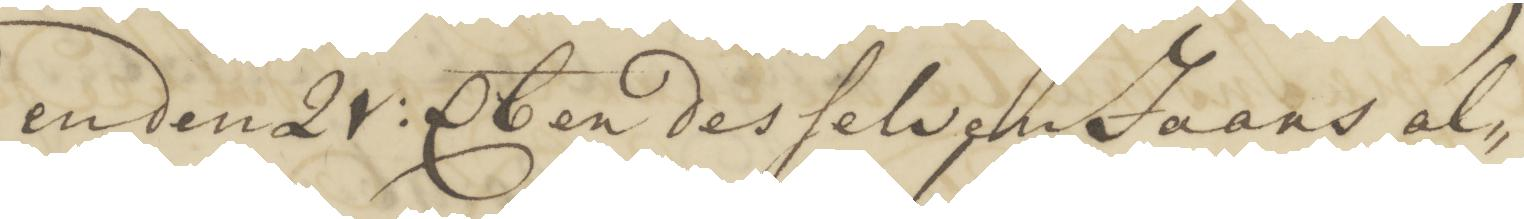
en den 21: xber desselven Iaars al„
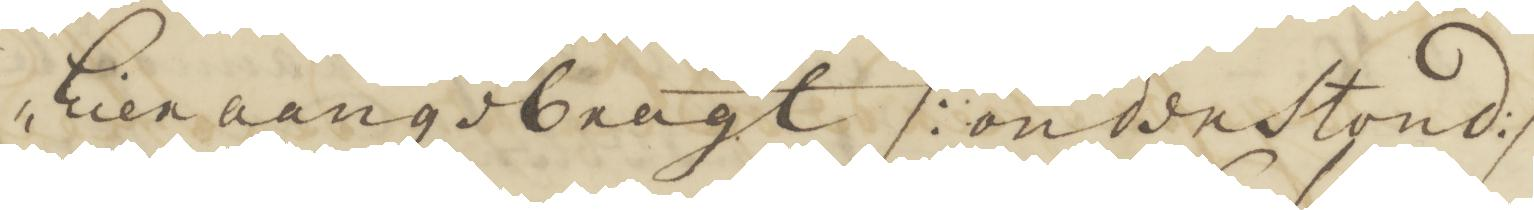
„hier aangebragt /:onderstond:/
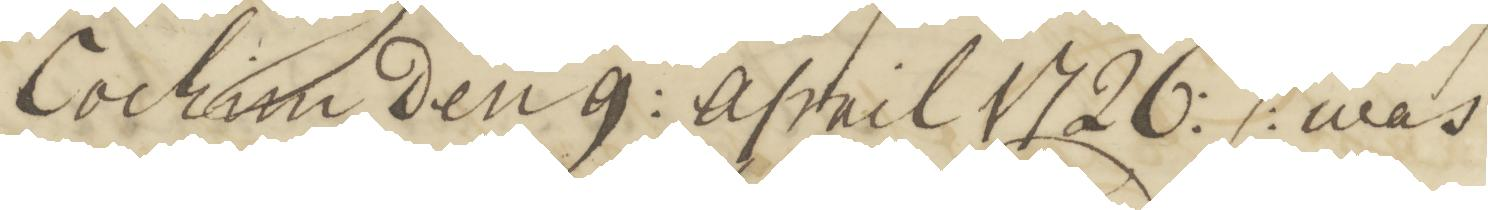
Cochim den 9: april 1726: /: was
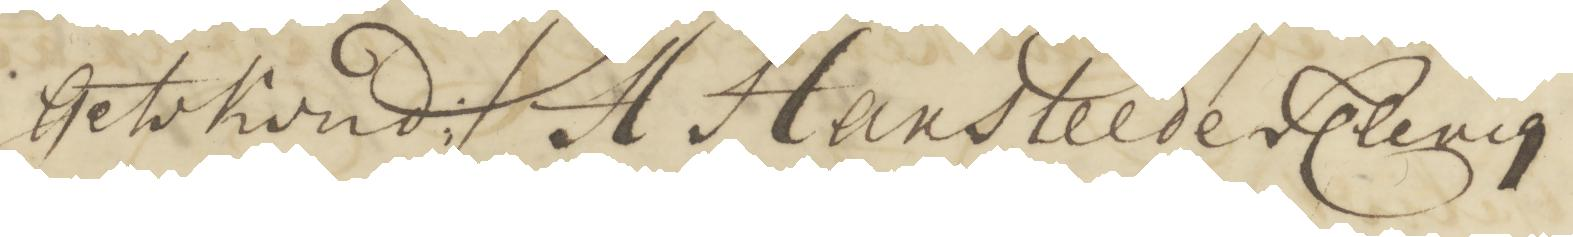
getekend :/ A Harsteede Eclercq
